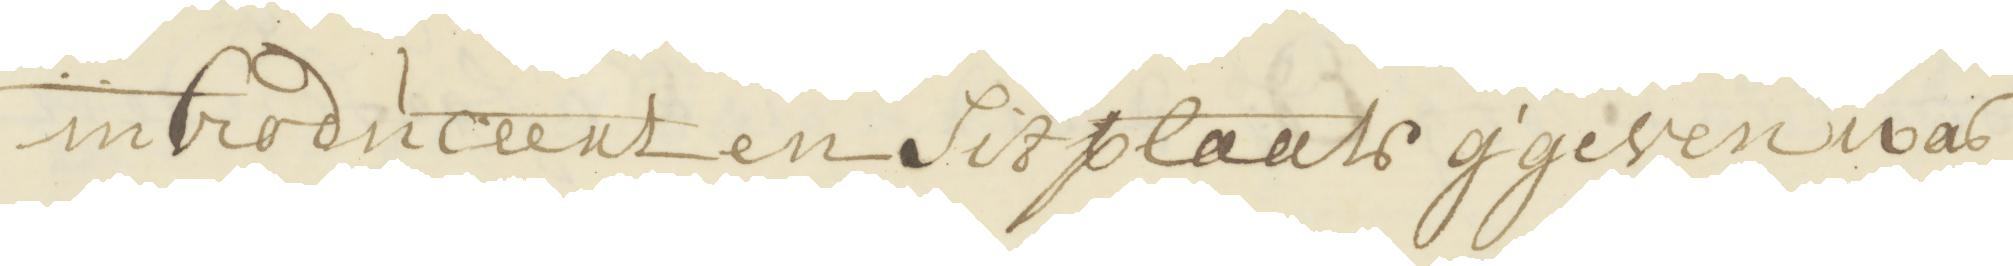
introduceert en sit plaats g’geven was
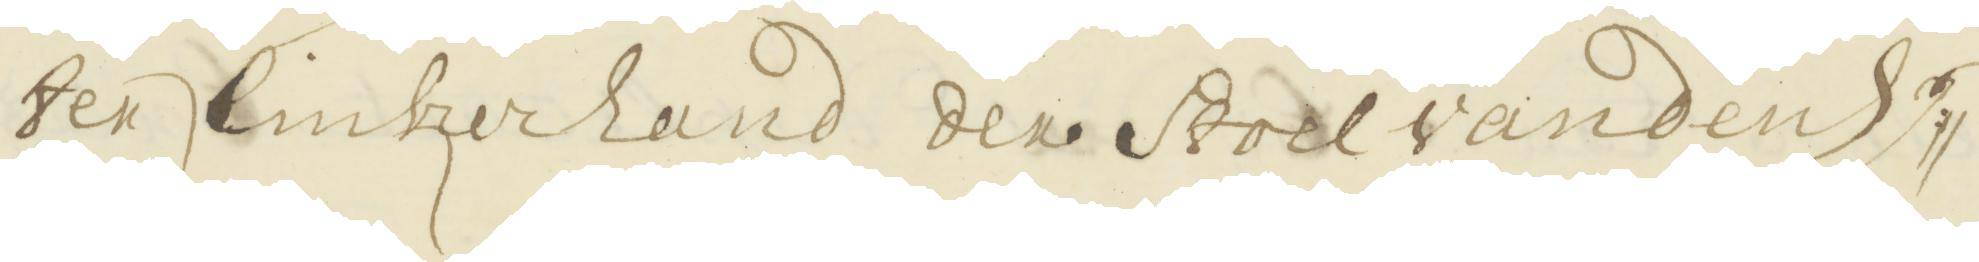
ter linkerhand der stoel van den h„r
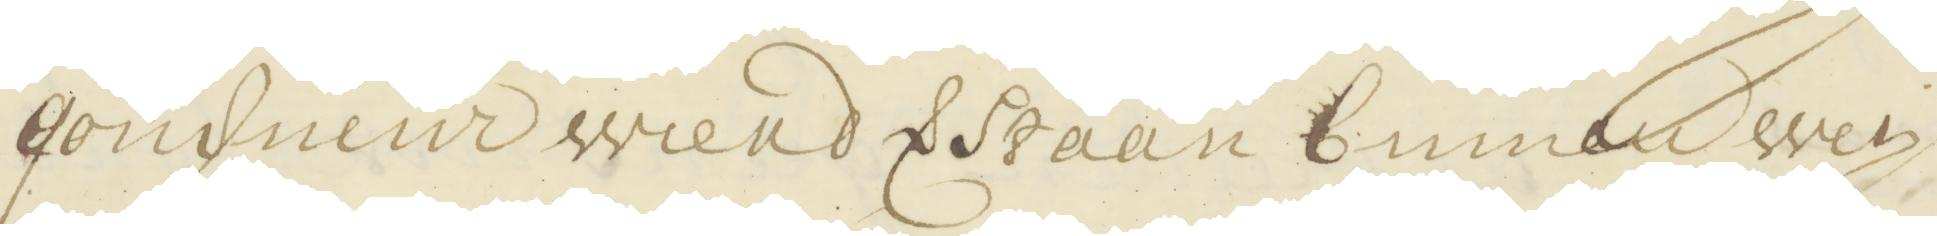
gouverneur wierd verstaan binnen weij
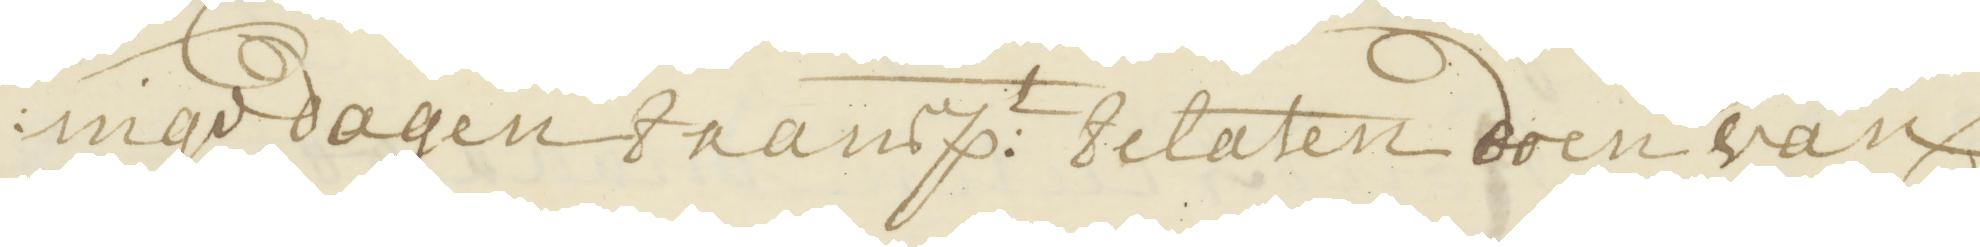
:nige dagen transp:t telaten doen van
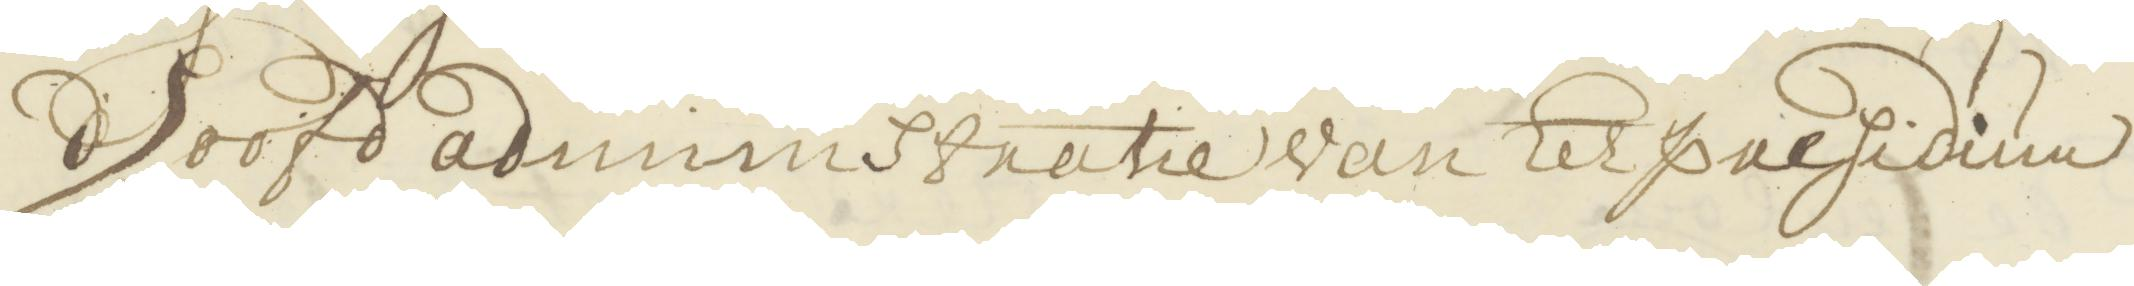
d' hoofd administratie van het presidium
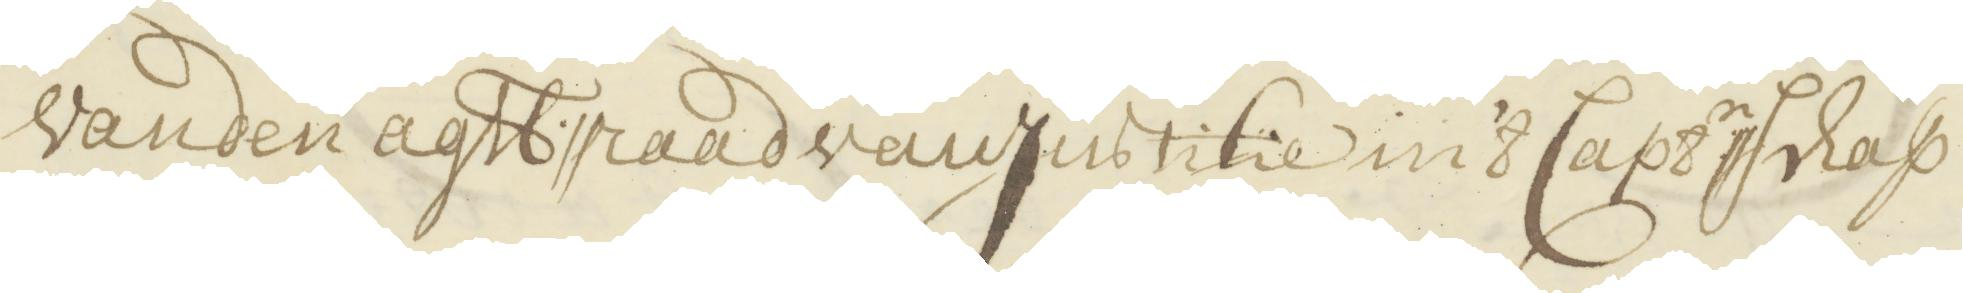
van den agtb: raad van Justitie in’t Capt„n schap
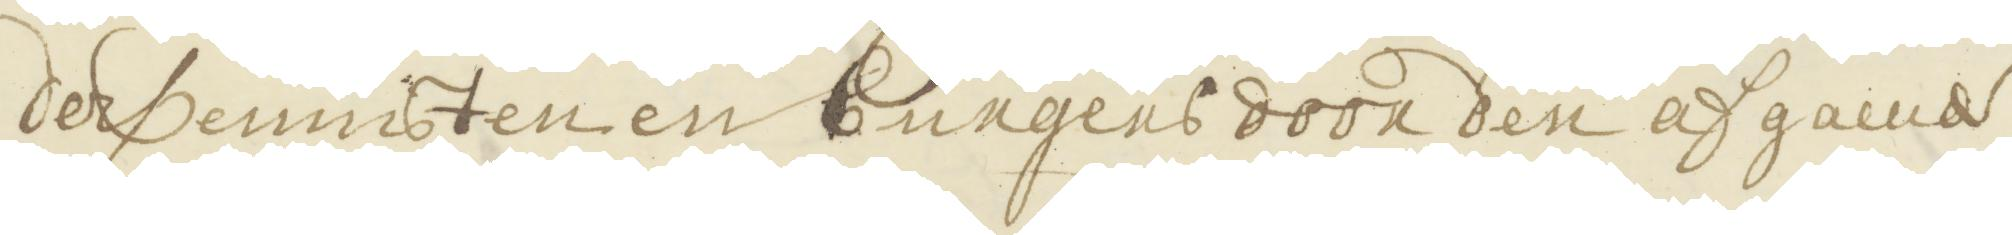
der pennisten en burgers door den afgaende
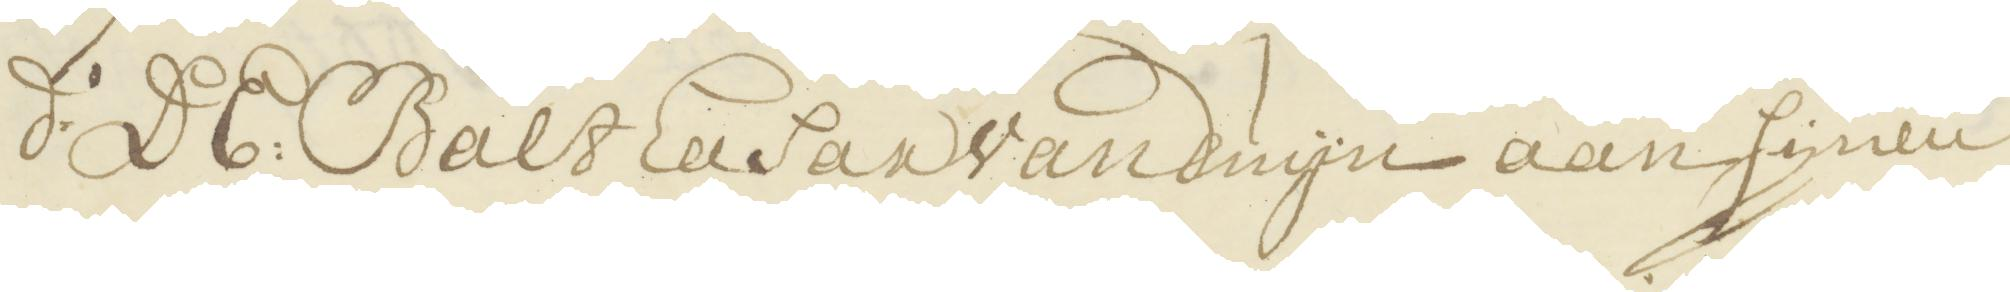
d=o D E: Balthasar van duijn aan sijnen
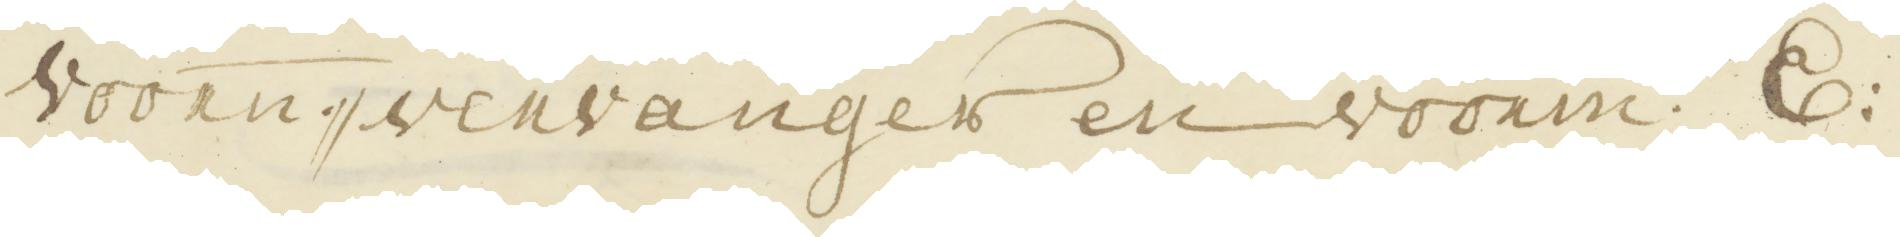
voorn.„ vervanger en voorm: E:
